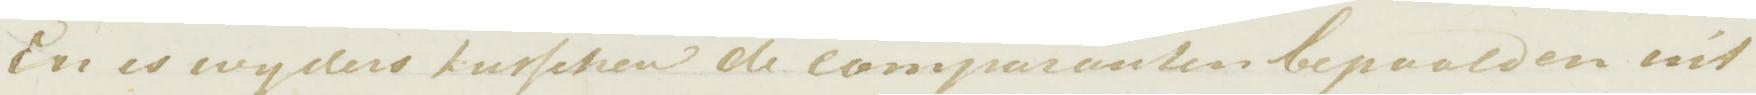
En is wyders tusschen de comparanten bepaalden uit
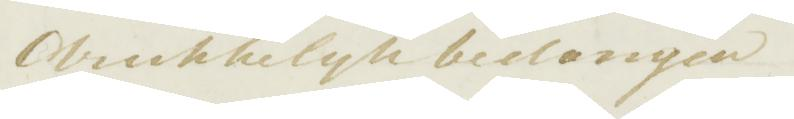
drukkelijk bedongen
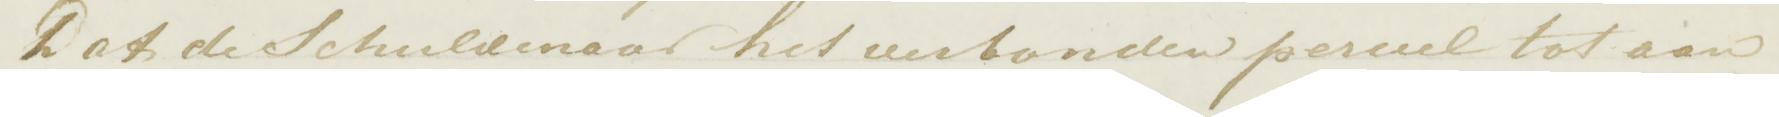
Dat de schuldenaar het verbonden perceel tot aan
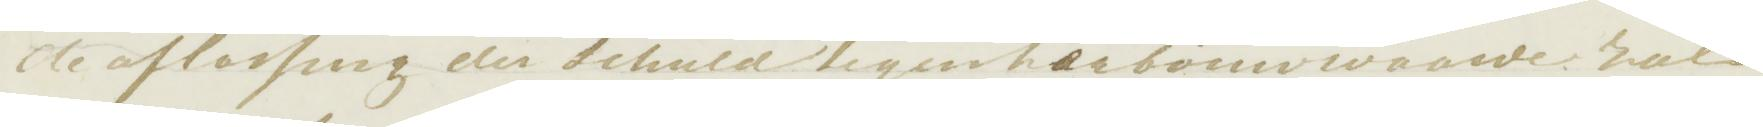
de aflossing der schuld tegen herbouwwaarde zal
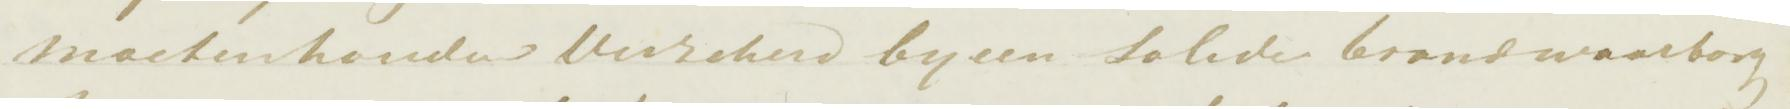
moeten houden verzekerd by een solide brand waarborg
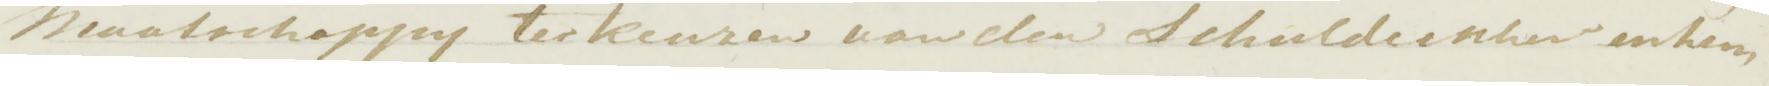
Maatschappy ter keuren van den schuldeischer en hem
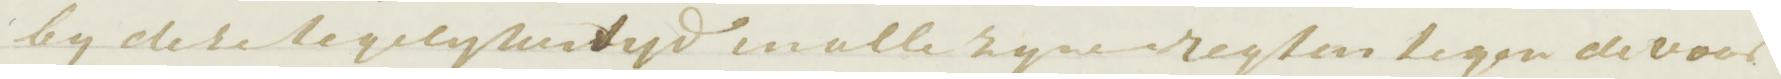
by deze tegelykertyd en alle zyne regten tegen de voor
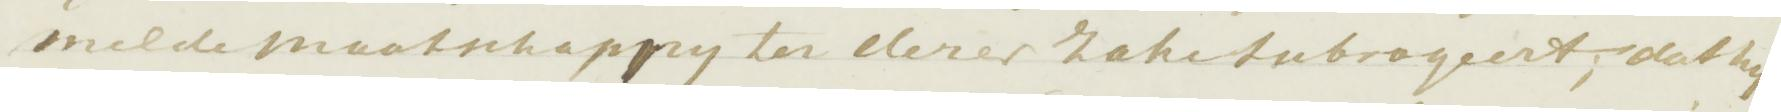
melde maatschappy ter dezer zake subregeert, dat hy
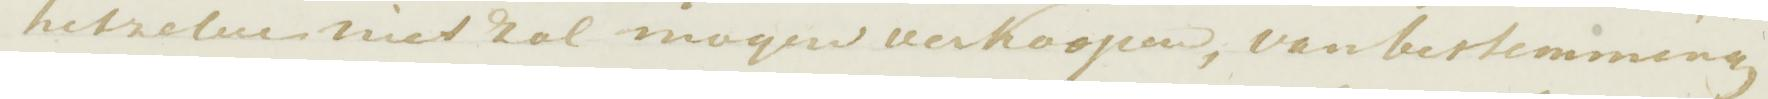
hetzelve niet zal mogen verkoopen, van bestemming
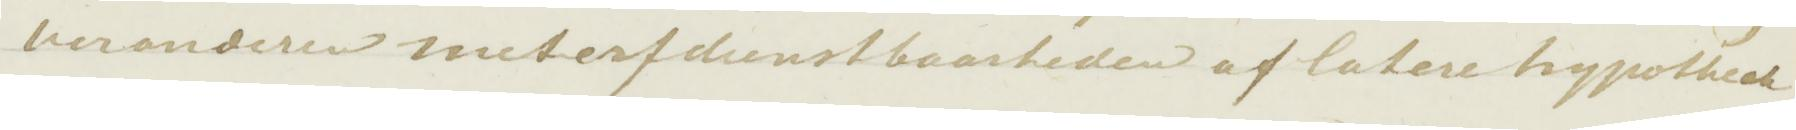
veranderen met erfdienstbaarheden af latere hypotheek
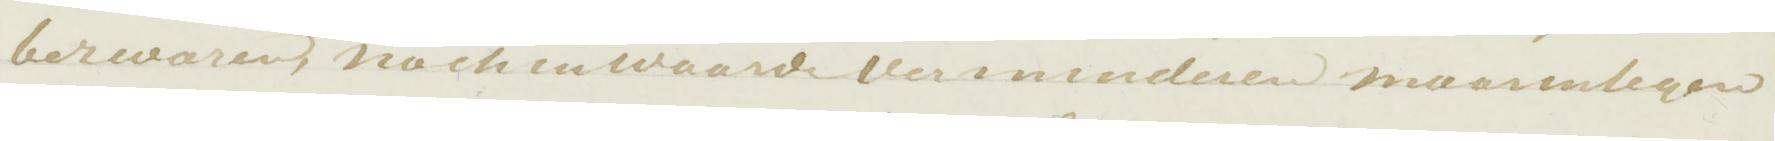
verwaren, noch en waarde verminderen maar integen
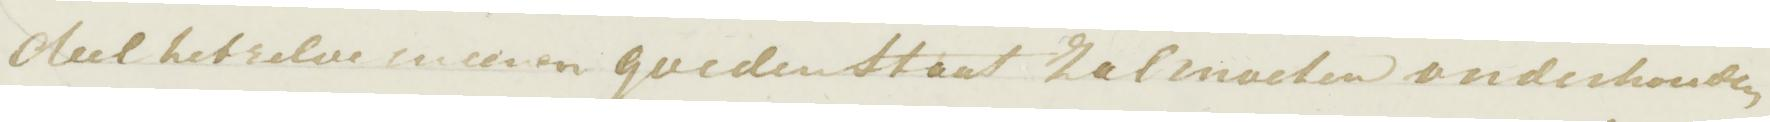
deel hetzelve neeven goeden staat zal moeten onderhouden
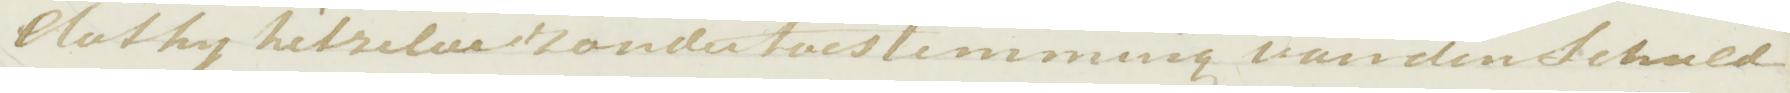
dat hy hetzelve zonder toestemming van den Schuld
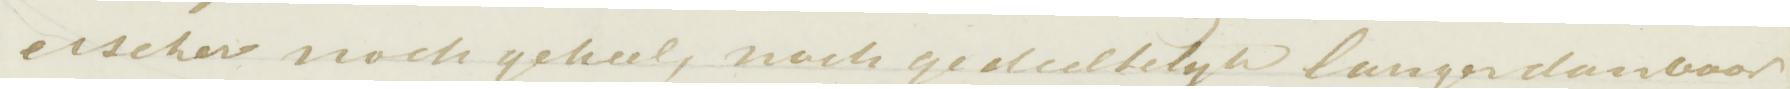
eischer noch geheel, noch gedeeltelyk langer dan voor
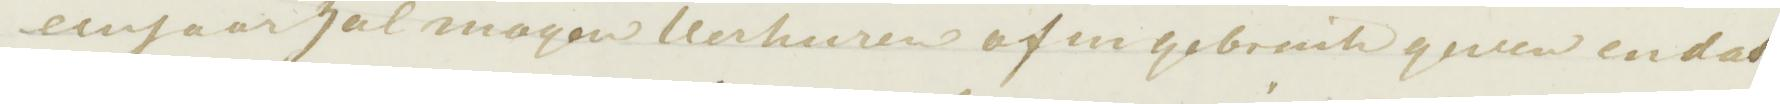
een jaar zal mogen verhuren of in gebruik geven en dat
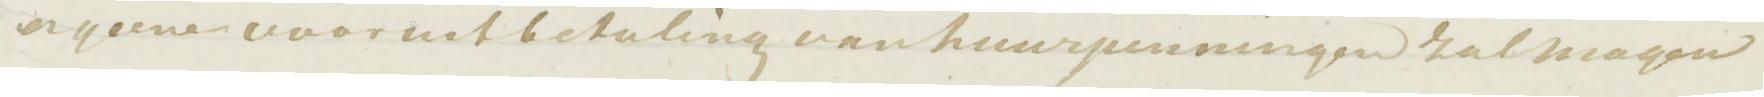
er geene vooruitbetaling van huurpenningen zal mogen
